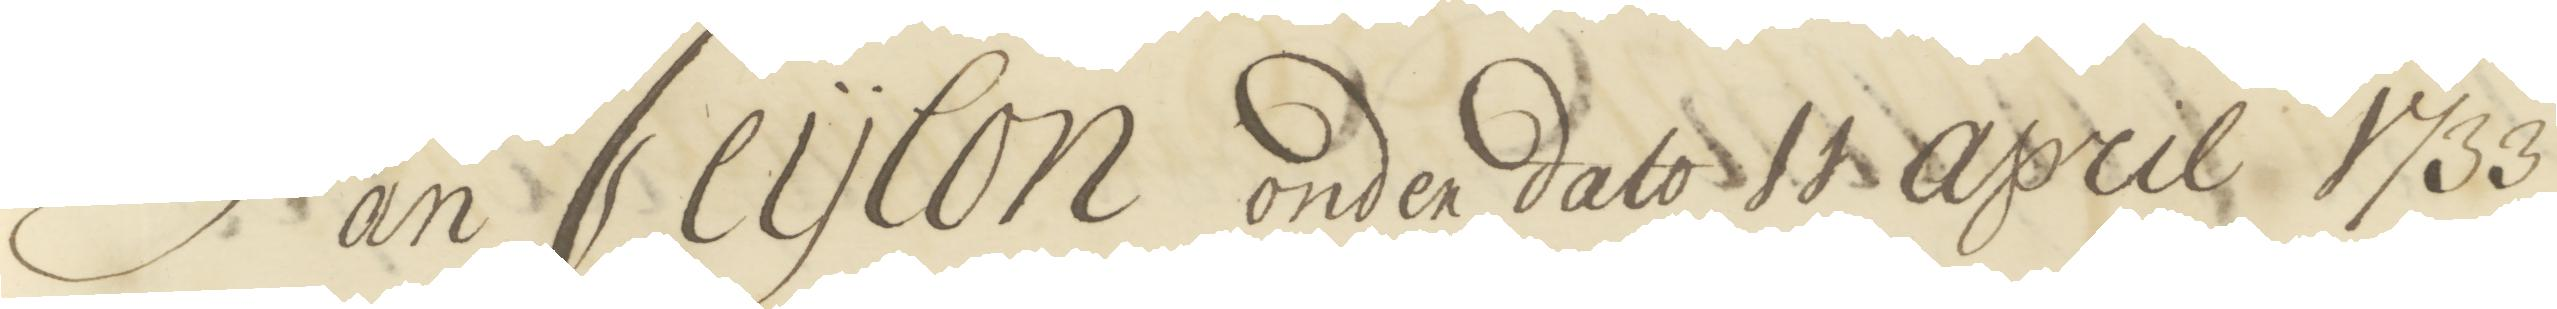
Van Ceijlon onder dato 11 april: 1733
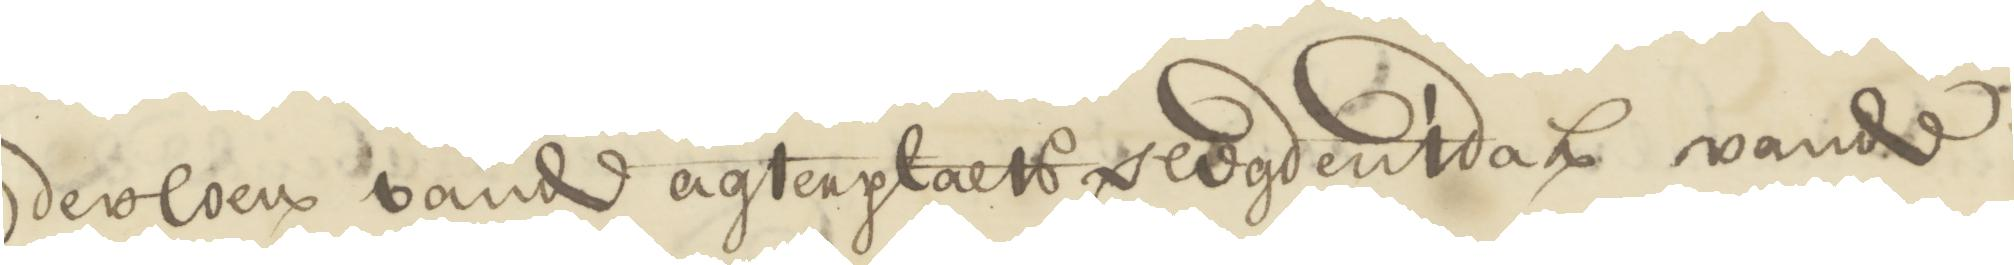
de vloer vande agterplaets verle„gd en'tdak vande
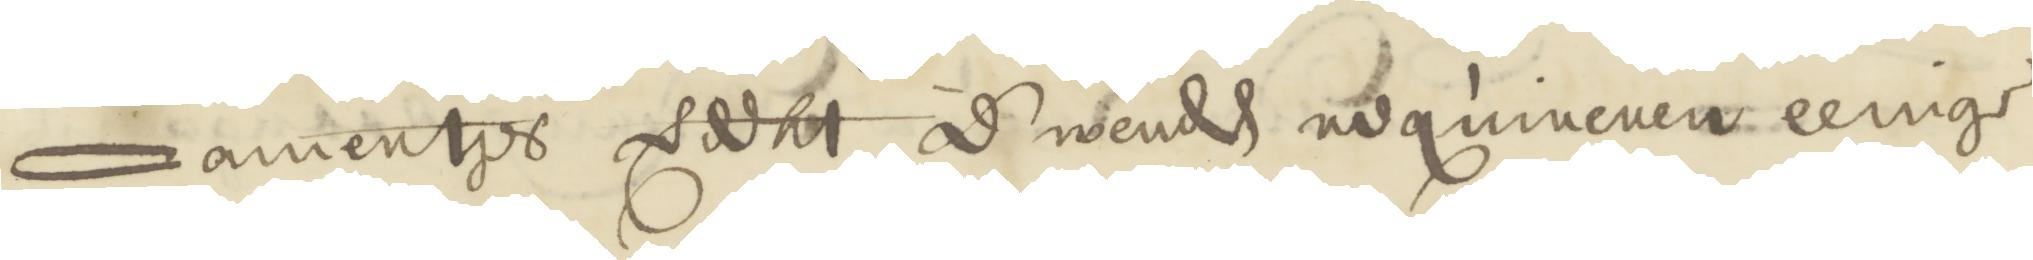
Camertjes verdekt te werden requireren eenige
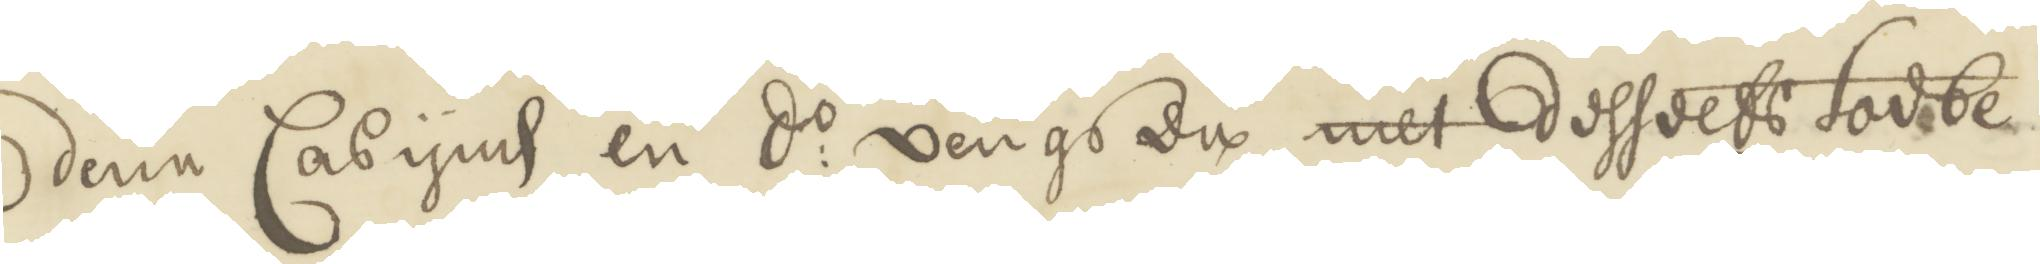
deur Casijnen en d:o vengster met desselfs toebe„
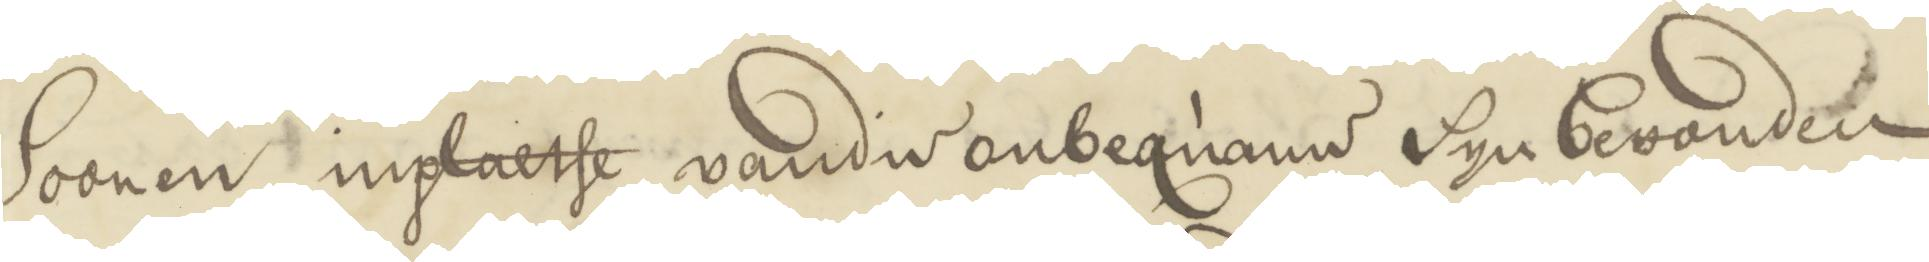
hooren inplaetse van die onbequame Syn bevonden
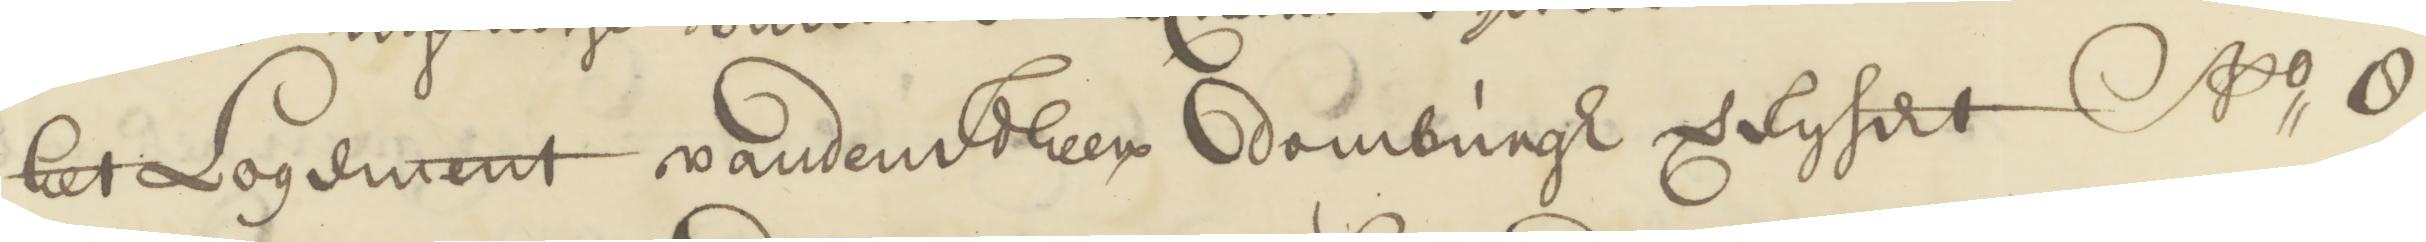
het Logement van den Ed heer domburgh vereyscht N„o 8
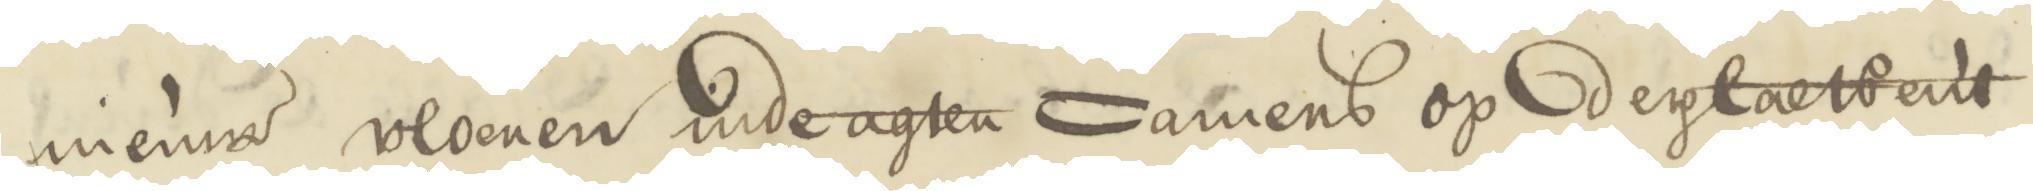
nieuwe vloeren inde agter Camers op de plaets en't
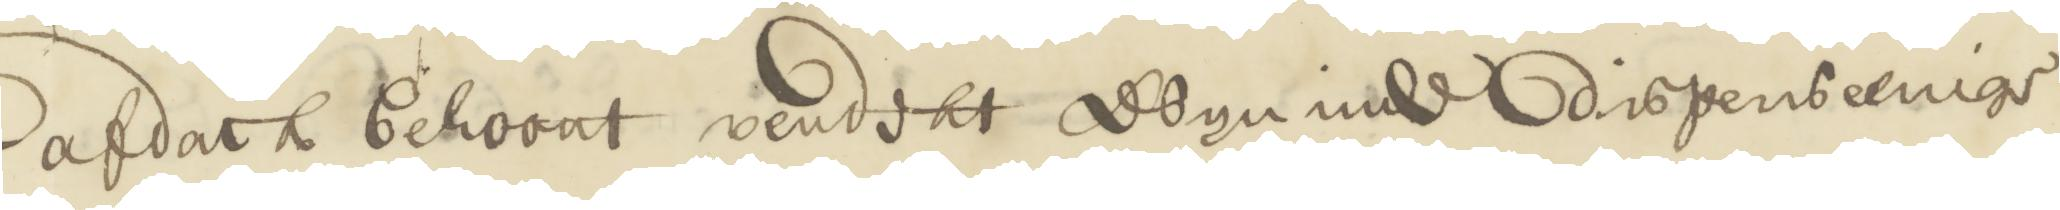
afdack behoort verdekt te syn inde dispens eenige
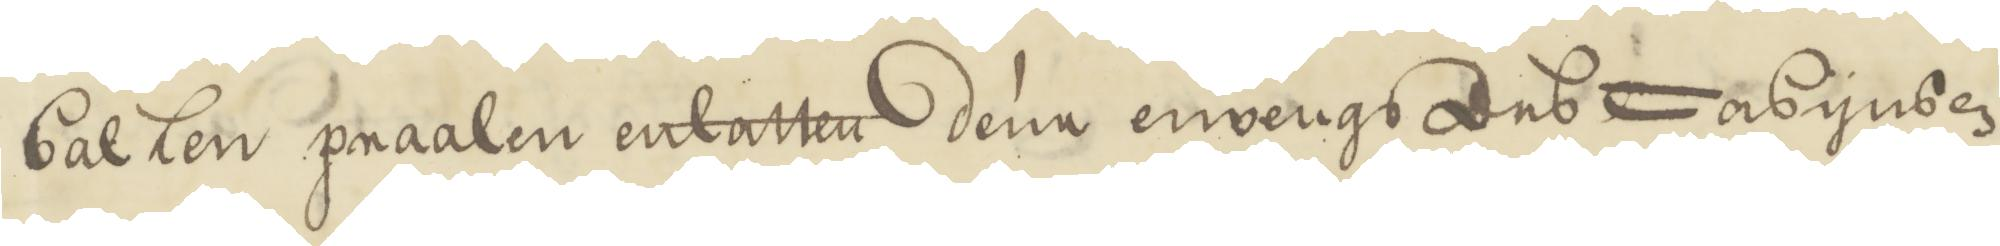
balken praalen en latten deur en vengsters Casijns en
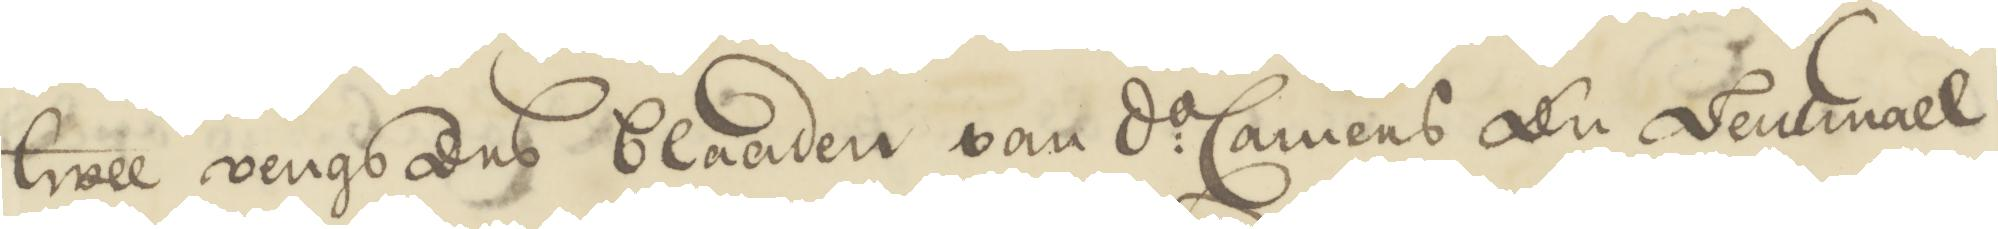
twee vengsters blaaden van d:o Camers ten Eenemael
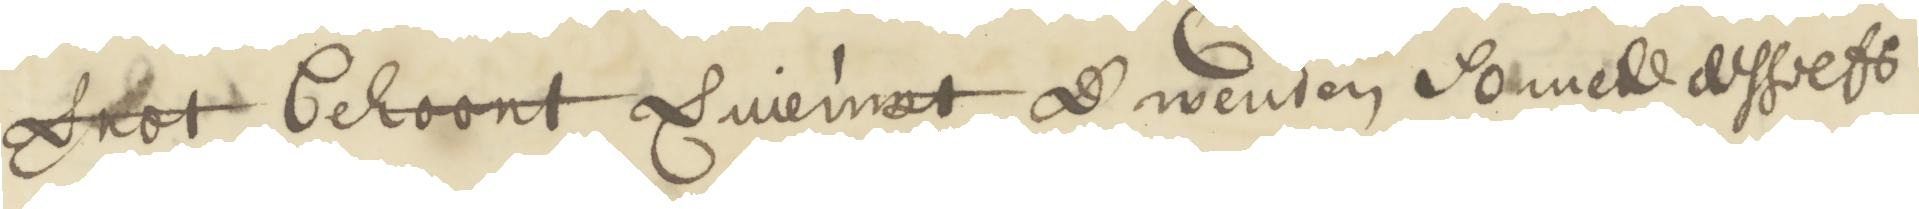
verrot behoort vernieuwt te werden somede desselfs
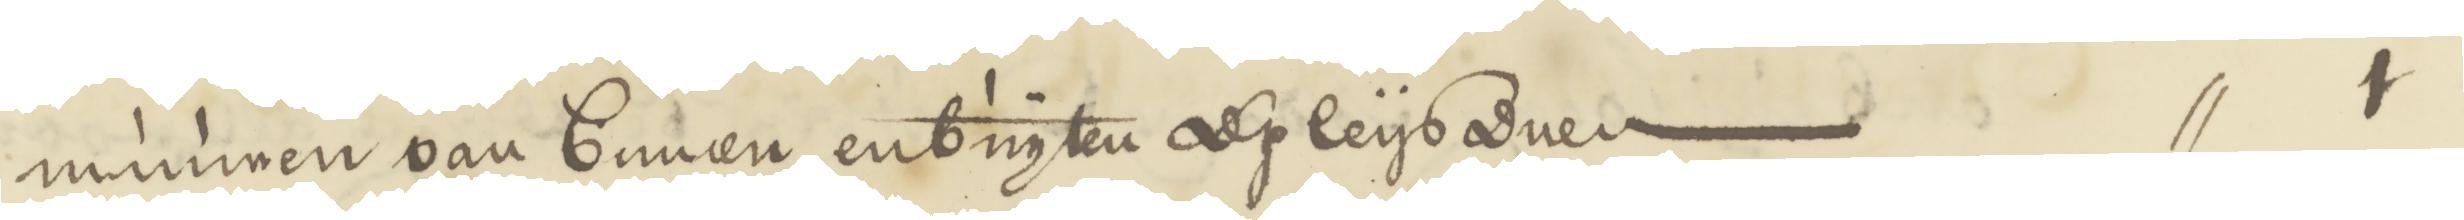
muuren van binnen en buijten te pleijsteren „ 1
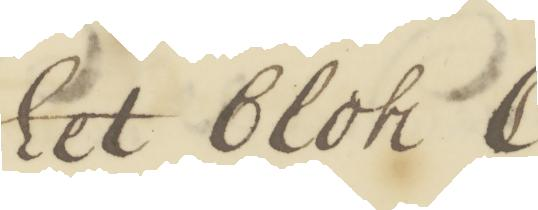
het blok C
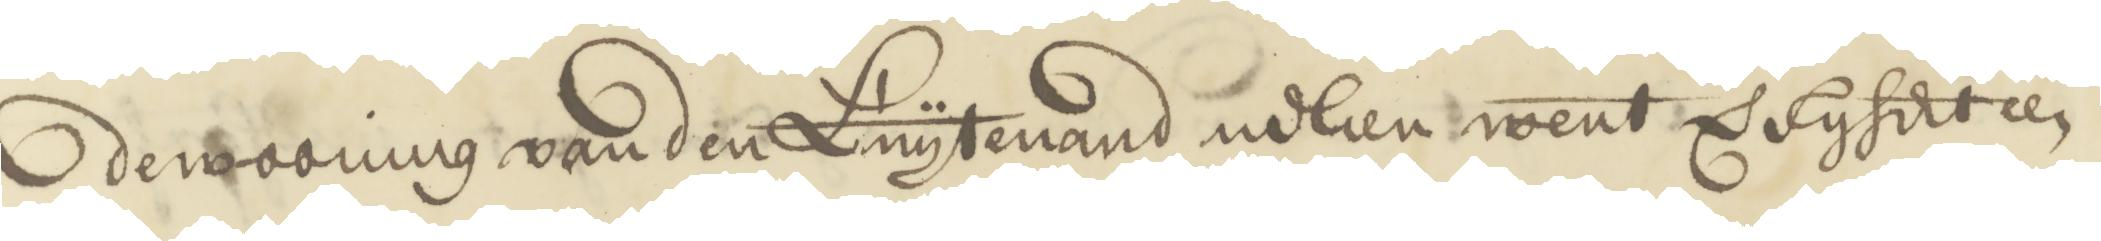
de wooning van den Luijtenand neker wert ver Eyscht een
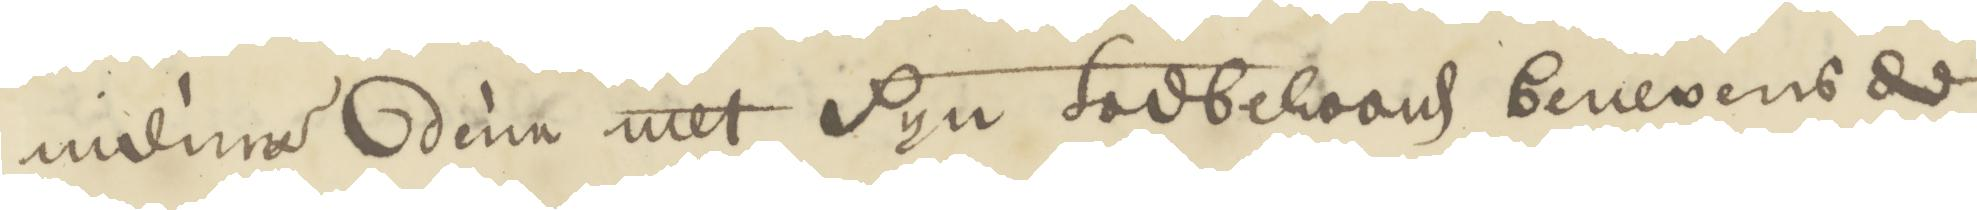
nieuwe deur met Syn toebehooren benevens de
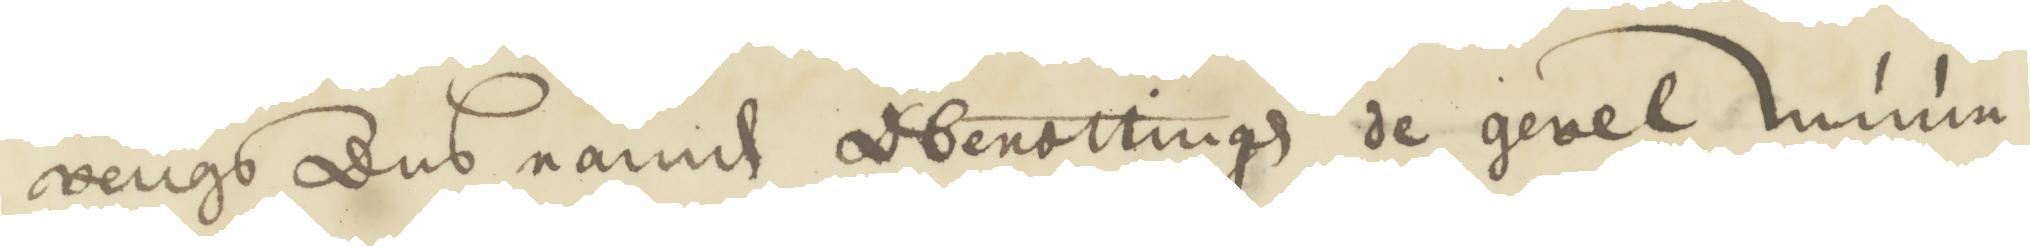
vengsters ramen te verottingen de gevel muur
